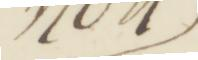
1764
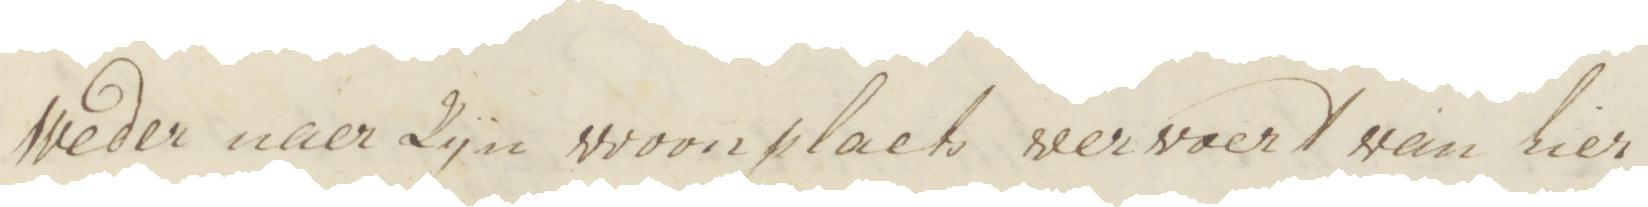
Weder naer zijn woonplaets vervoert van hier
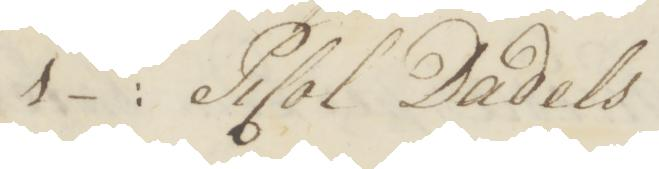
1-: Picol Dadels
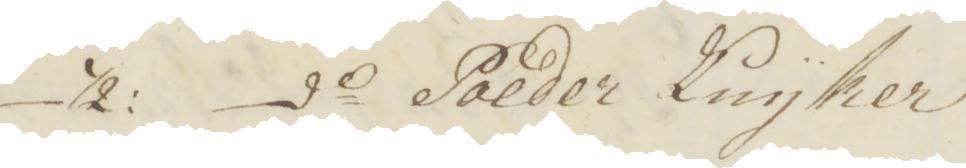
_½: d=o Poeder Zuijker
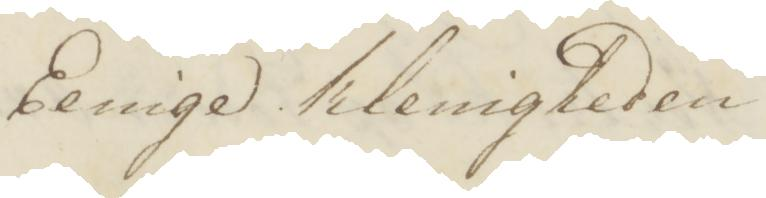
Eenige klenigheden
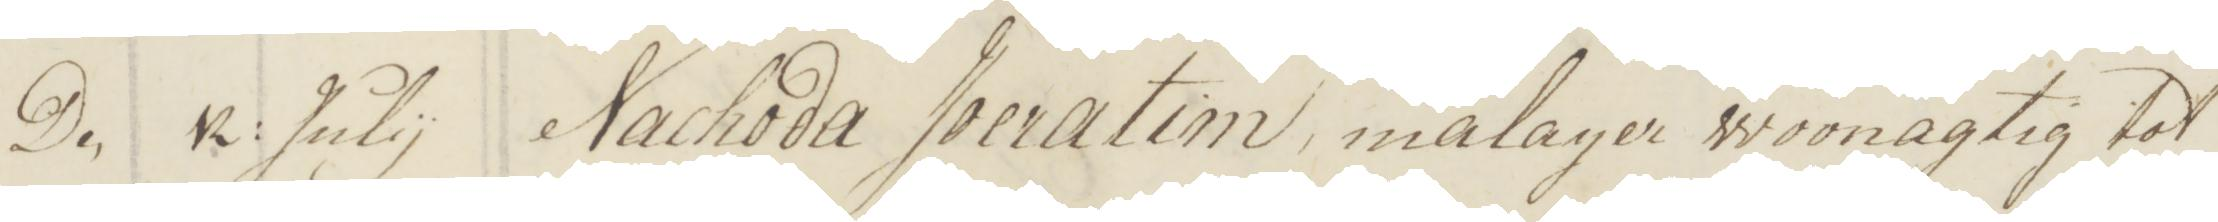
De 12: Julij Nachoda Joeratim, malayer woonagtig tot
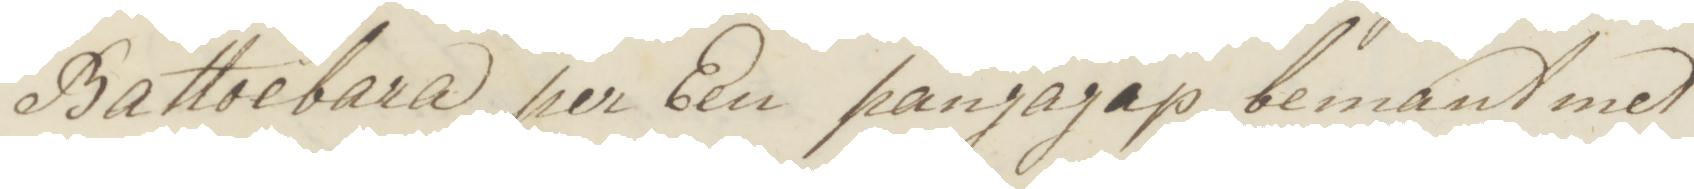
Battoebara per Een pangagap bemant met
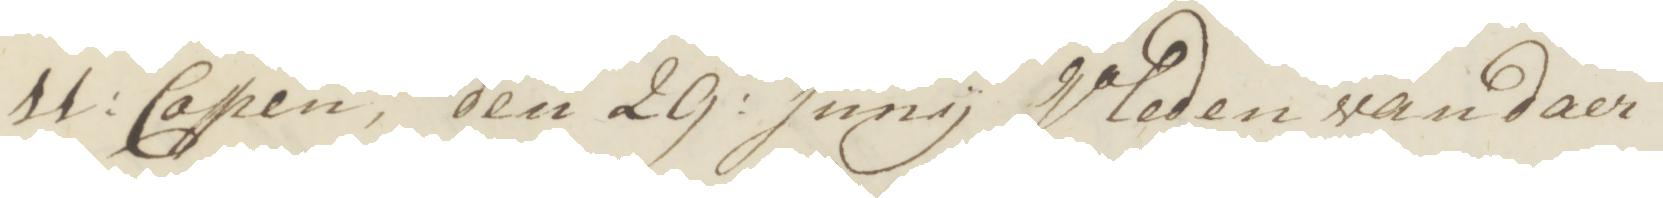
11: Coppen, den 29: Junij Joleden van daer
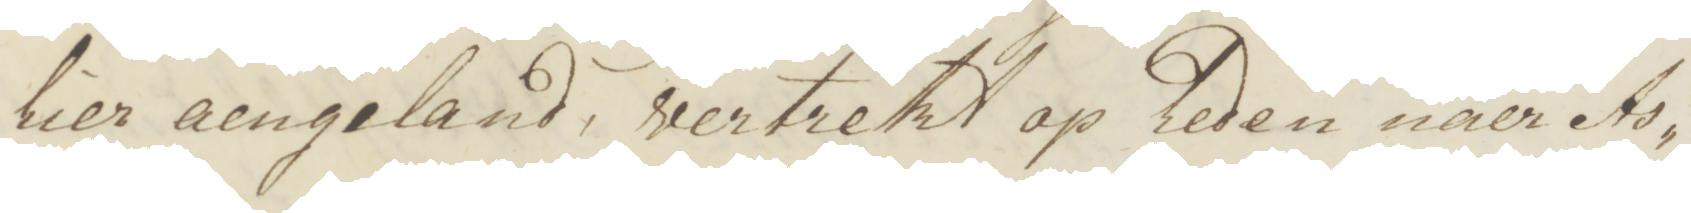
hier aengeland, vertrekt op heden naer As„
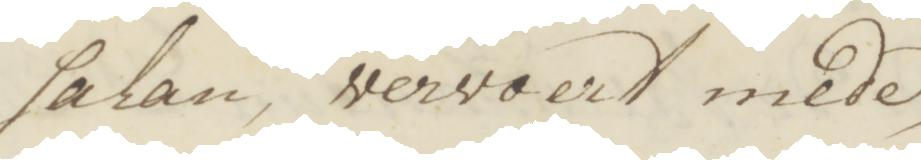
sahan, vervoert mede
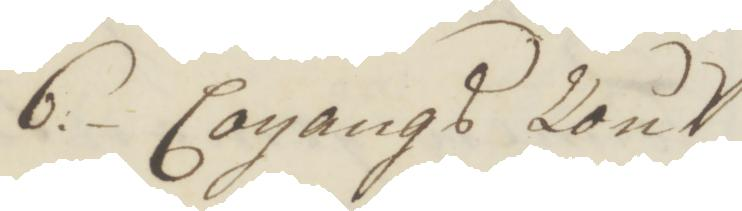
6:- Coyangs zout
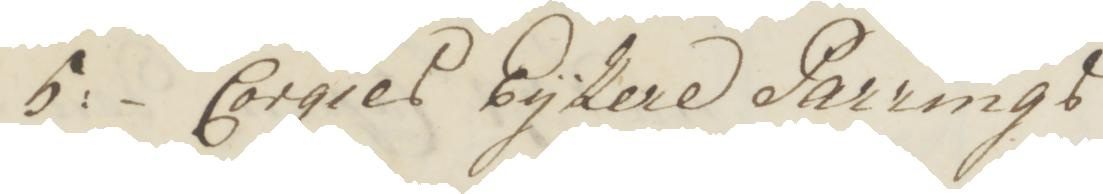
5:- Corgies Eijzere Parrings
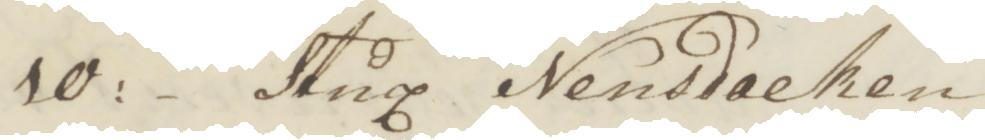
10:- stux Neusdoeken
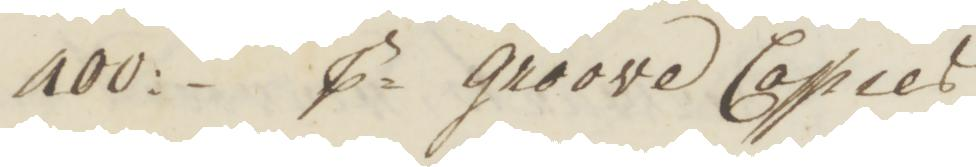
400:- p=s groove Coppies
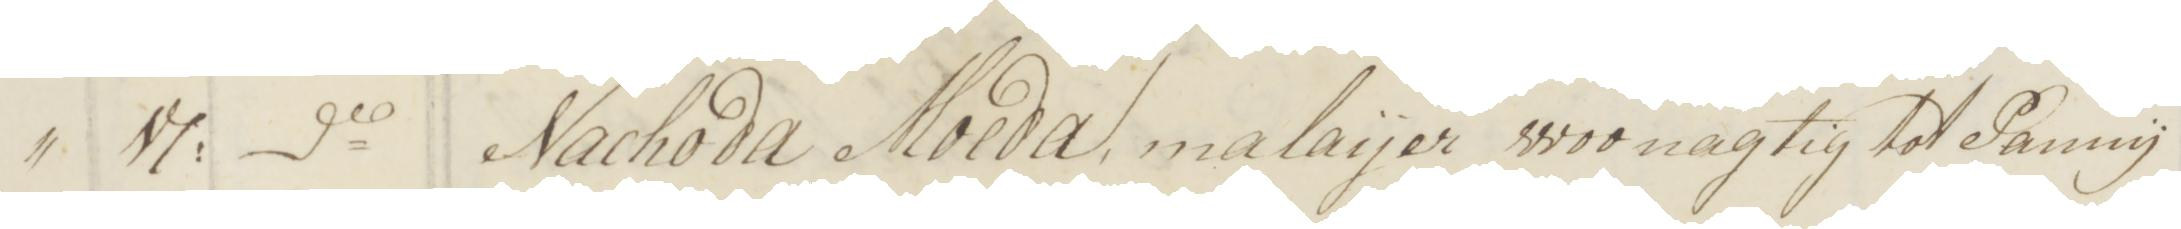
„ 17: d=o Nachoda Moeda, malaijer woonagtig tot Pannij
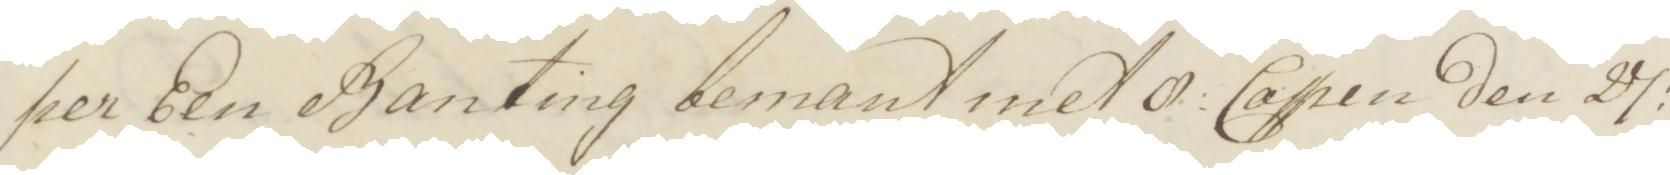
per Een Banting bemant met 8: Coppen den 27
